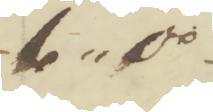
6 „ do
